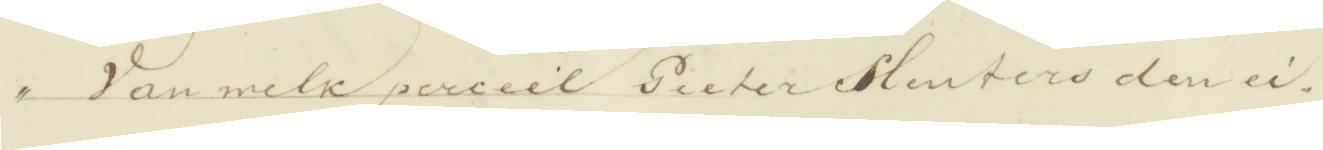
„ Van welk perceel Pieter Sluiters den ei„
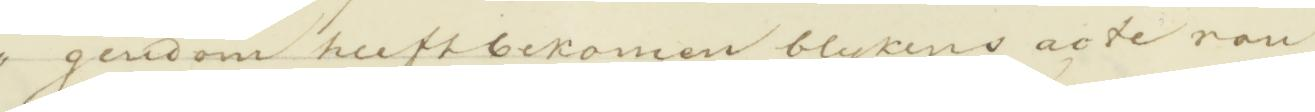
gendom heeftbekomen blykens acte van
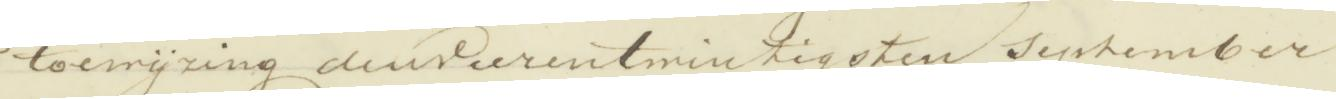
toewijzing denvierentwintigsten September
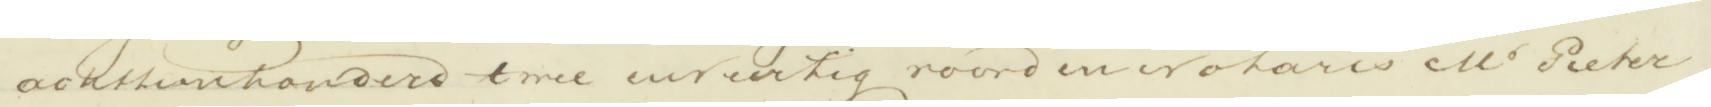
achttienhonderd twee enveertig voorden Notaris Mr Pieter
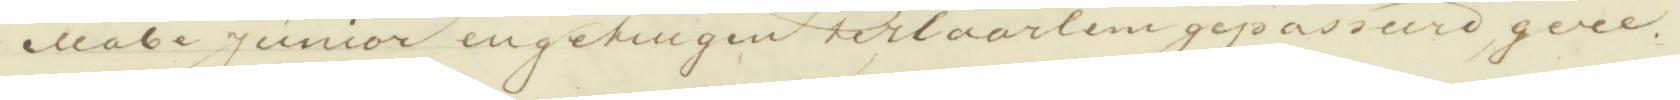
Mabe Junior en getuigen teHaarlem gepasseerd, gere.
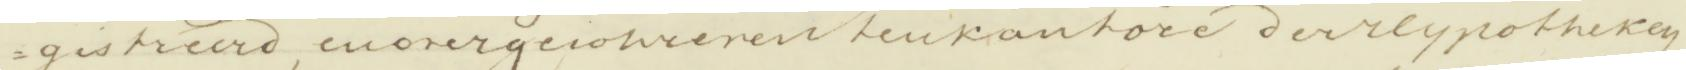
=gistreerd enovergeschreven tenkantore derHypotheken
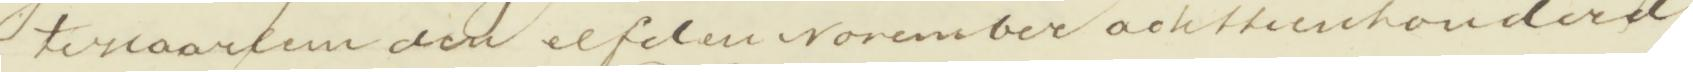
teHaarlem den elfden November achttienhonderd
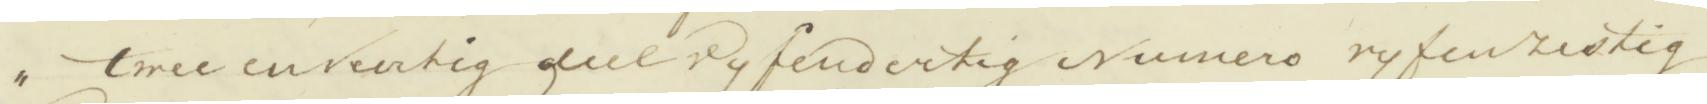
„ twee enveertig deel vyfendertig Numero vyfenzestig
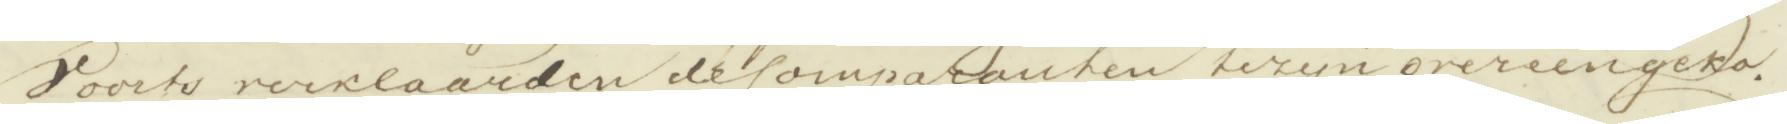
Voorts verklaarden deComparanten tezyn overeengeko.
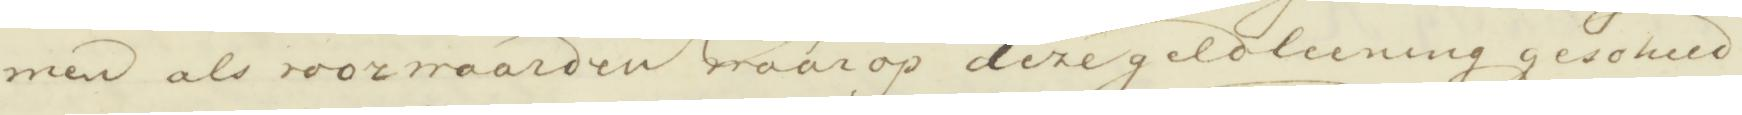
men als voorwaarden waarop deze geldleening geschied
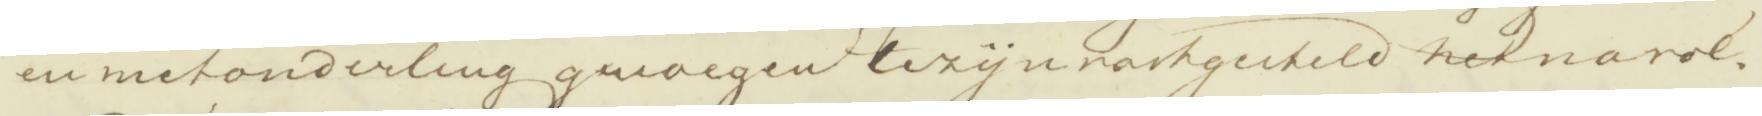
en metonderling genoegen tezijn vastgesteld hetnavol„
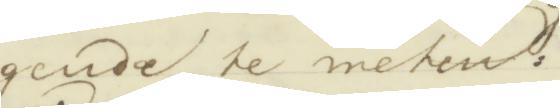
gende te meten.
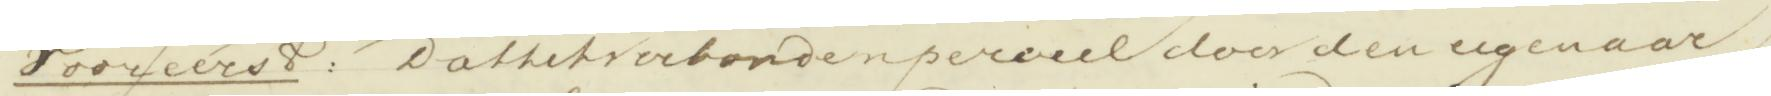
Vooreerst : Dathetverbonden perceel door den eigenaar
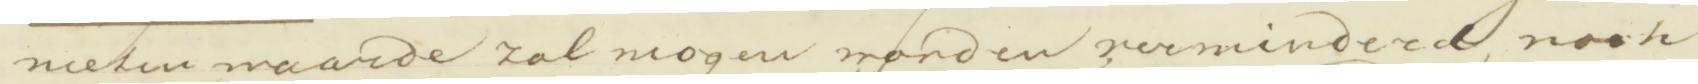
nietin waarde zal mogen worden verminderd, noch
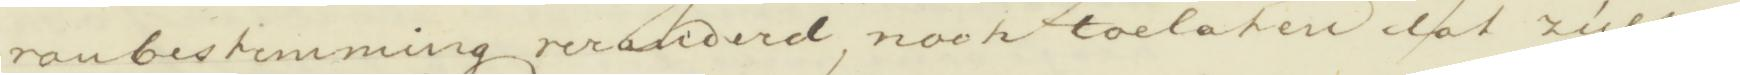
van bestemming veranderd, noch toelaten dat zulks
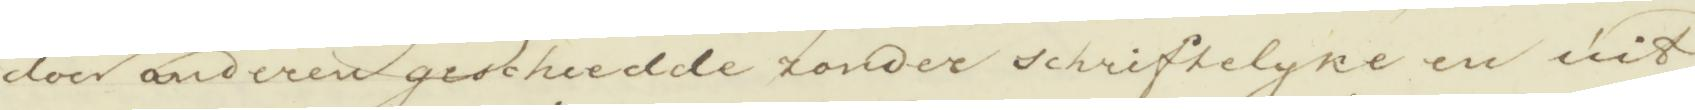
door anderen geschiedde zonder schriftelyke en uit
